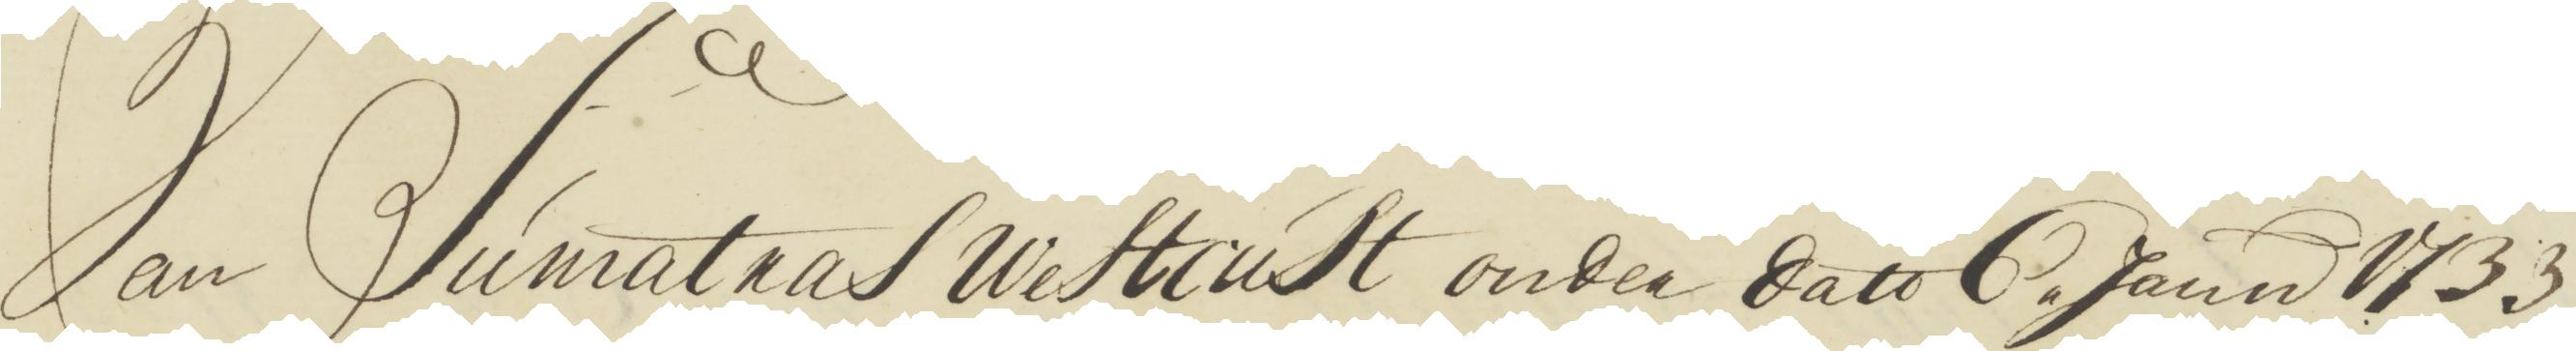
Van Sumatrus Westcust onder dato 6„' Jann 1733
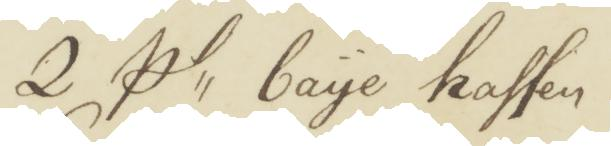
2. p„s baije kassen
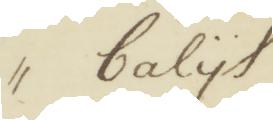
6 „ balijs
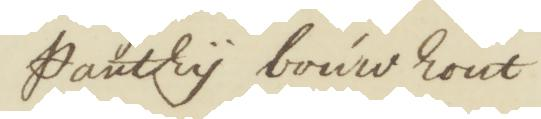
parthij bouw hout
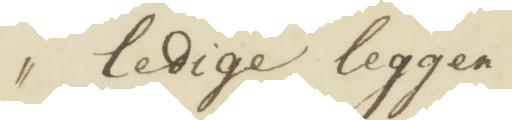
1 „ ledige leggen
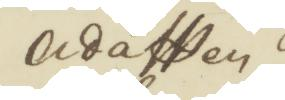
adappen
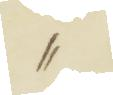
7035 „
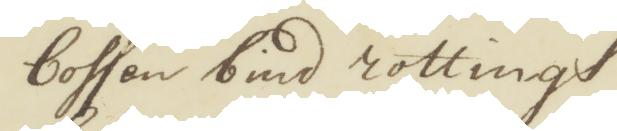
bossen bind rottings
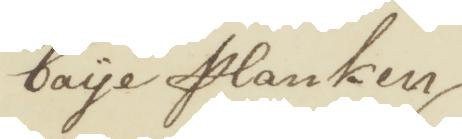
baije planken
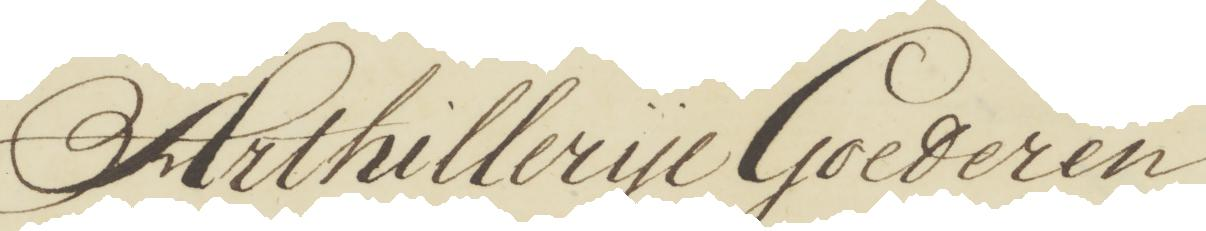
Arthillerije Goederen
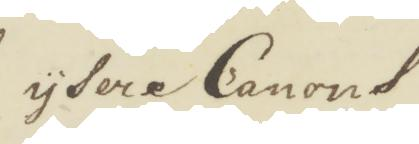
ijsere Canons
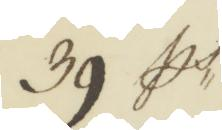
39 p„s
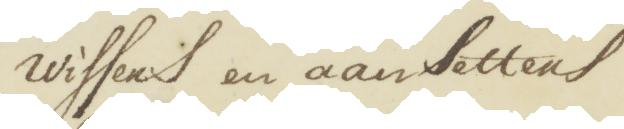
wissers en aansetters
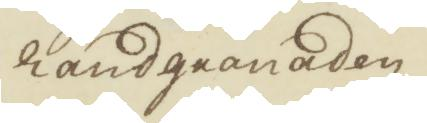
handgranaden
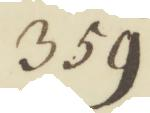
359
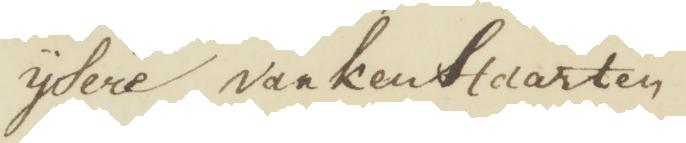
ijsere varkenstaarten
